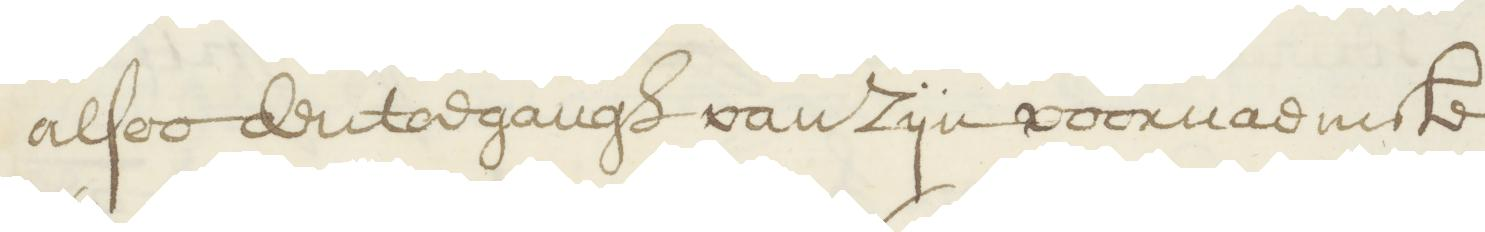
alsoo den toegangh van zijn voornaemste
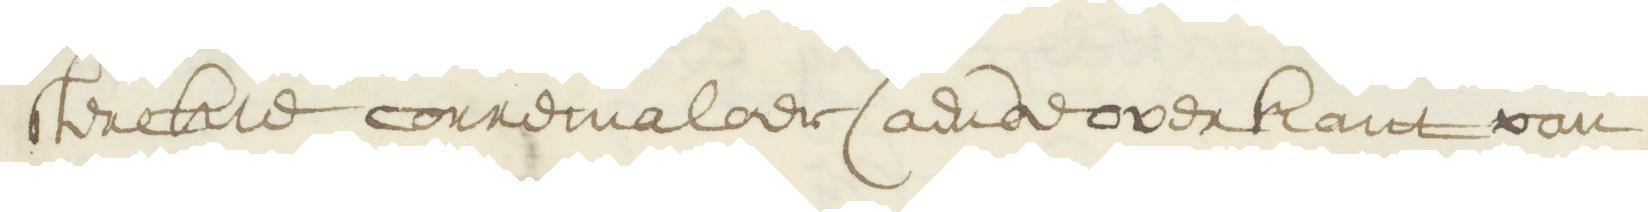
sterckte corremaloer (aen de overkant van
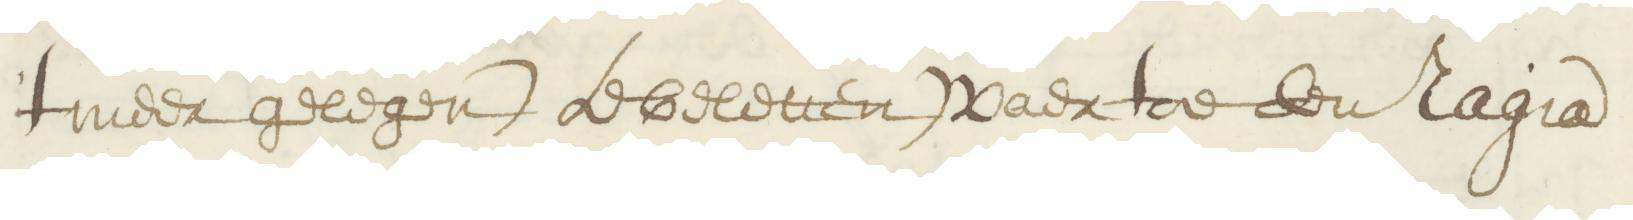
’t meer gelegen) te beletten waertoe den ragia
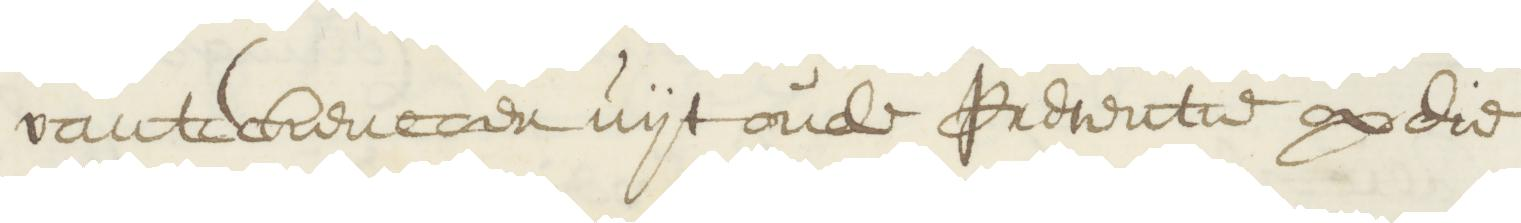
van teckencoer uijt oude pretentie op die
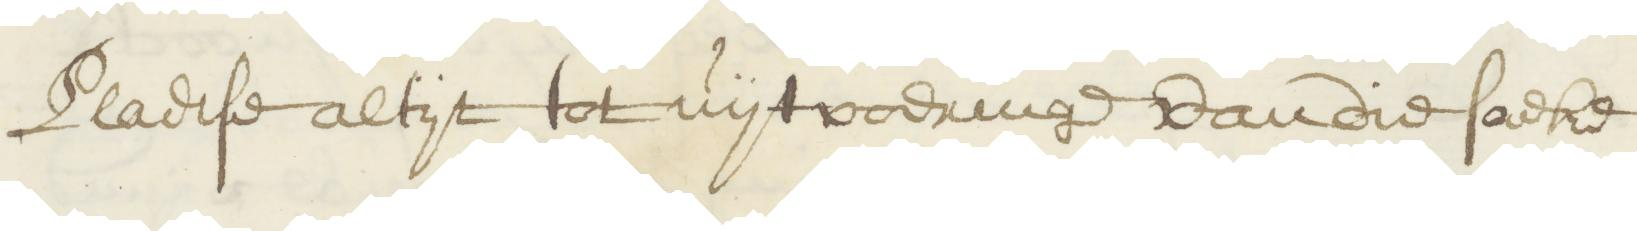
Plaetse altijt tot uijtvoeringe van die saeke
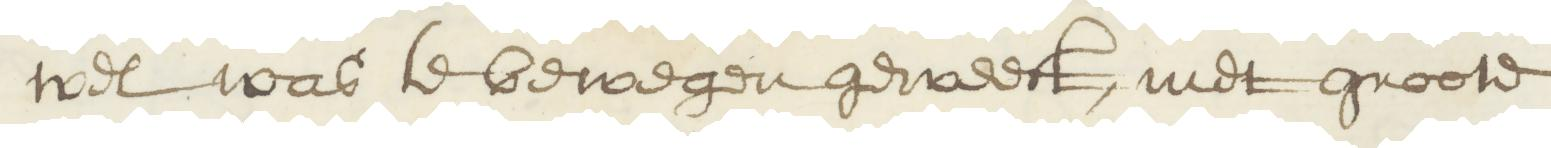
wel was te bewegen geweest, met groote
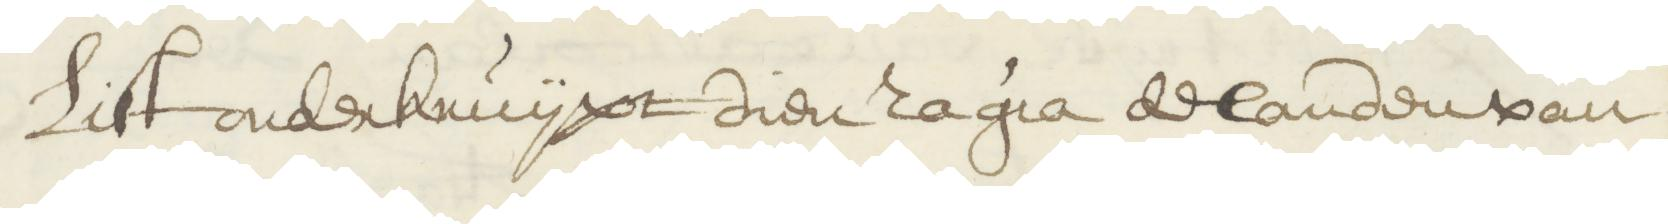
List onderkruijpt dien ragia de landen van
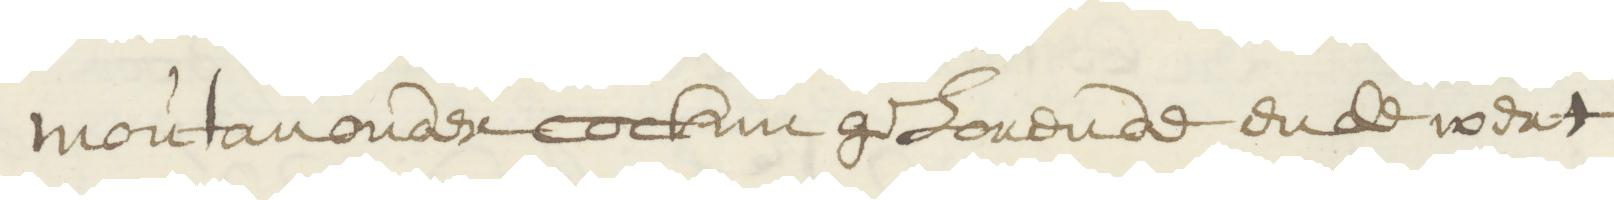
moutan onder cochin gehorende ende wert
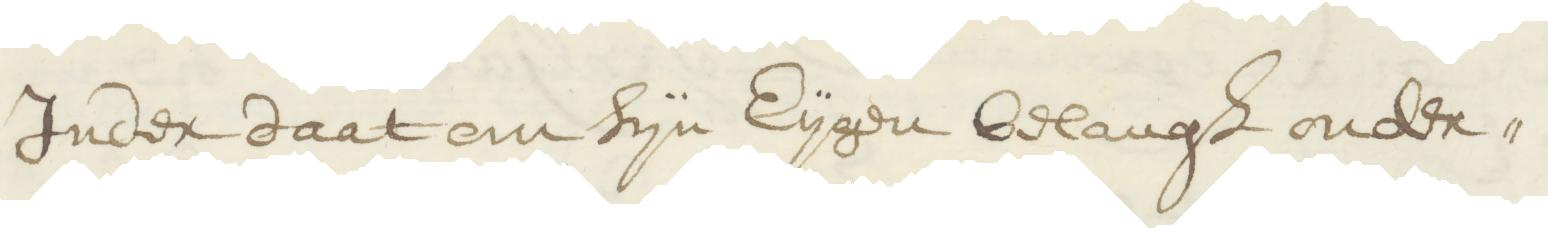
Jnderdaat om sijn Eijgen belangh onder„
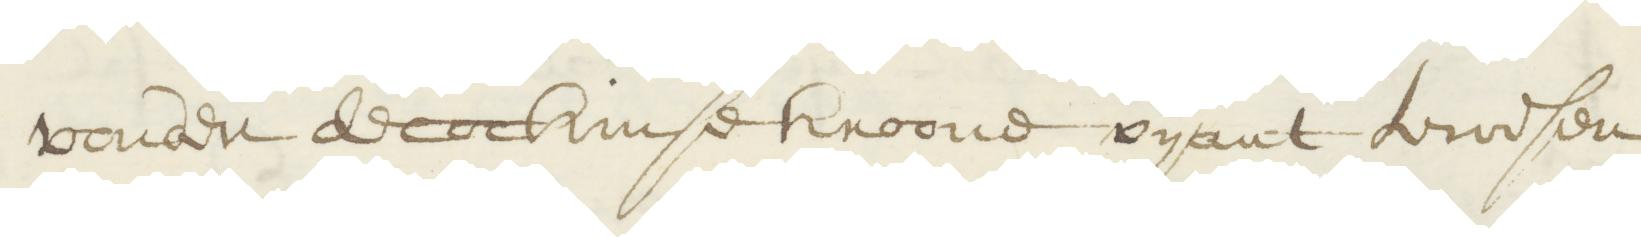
vonden de cochinse kroone vijant tewesen
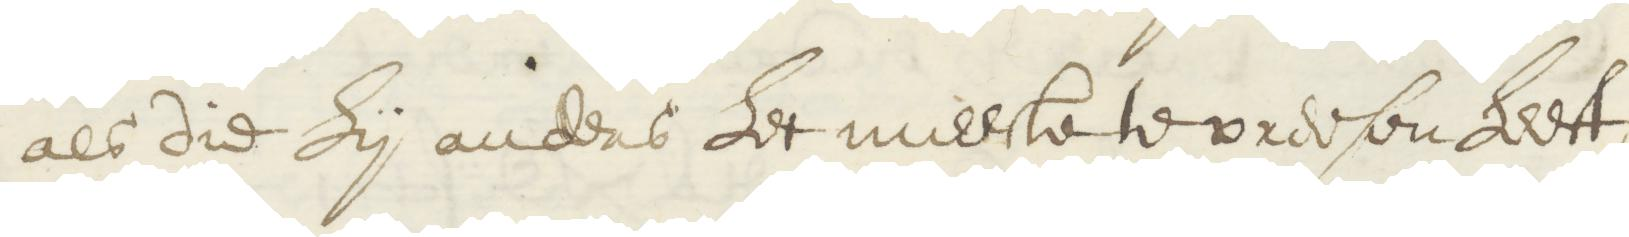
als die hij anders het meeste te vreesen heeft
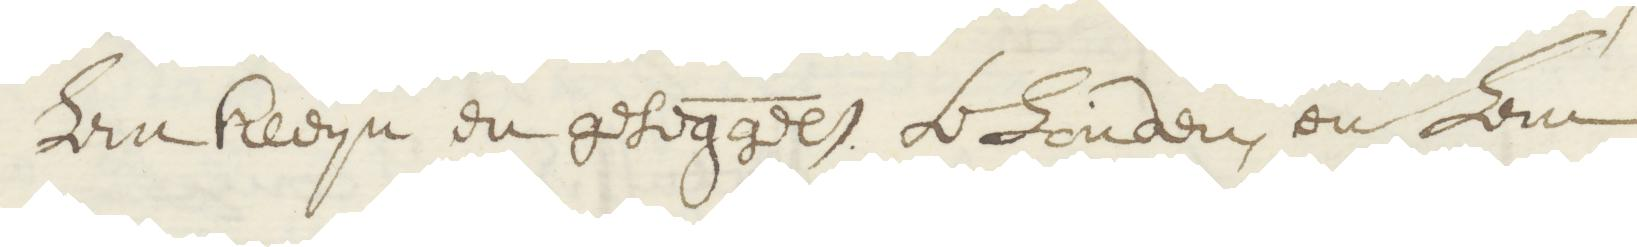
hem kleijn en geseggelijk te houden, en hem
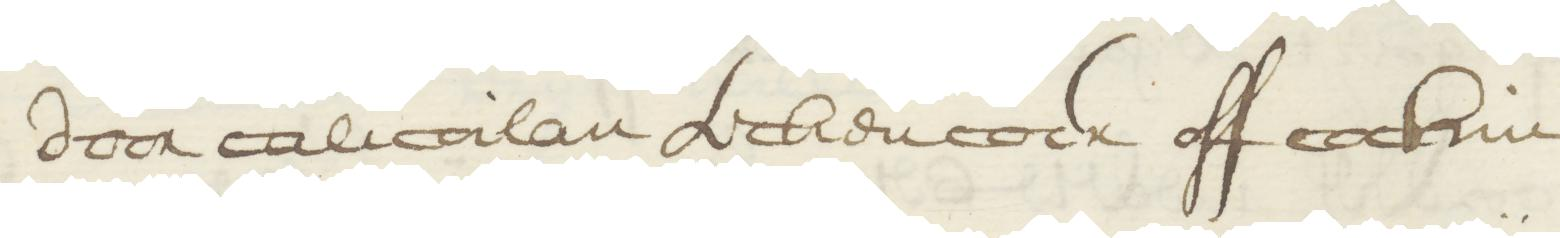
door calicoilan teckencoer off cochin
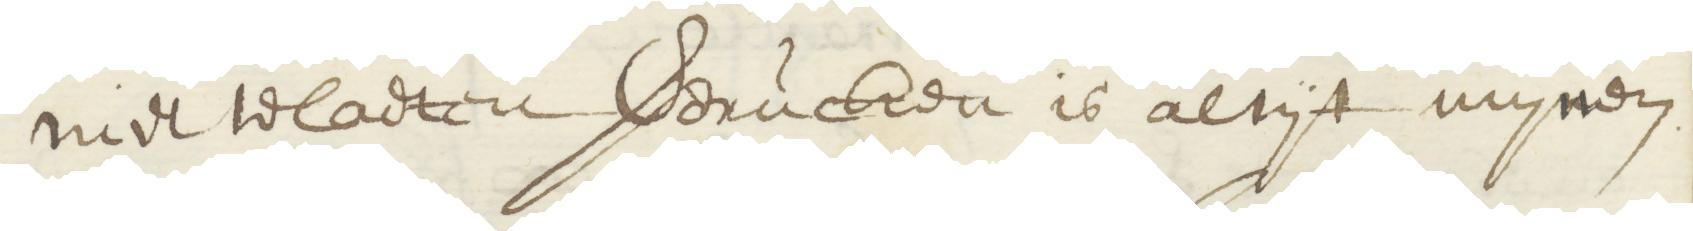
niet te laeten verdrucken is altijt mijnen
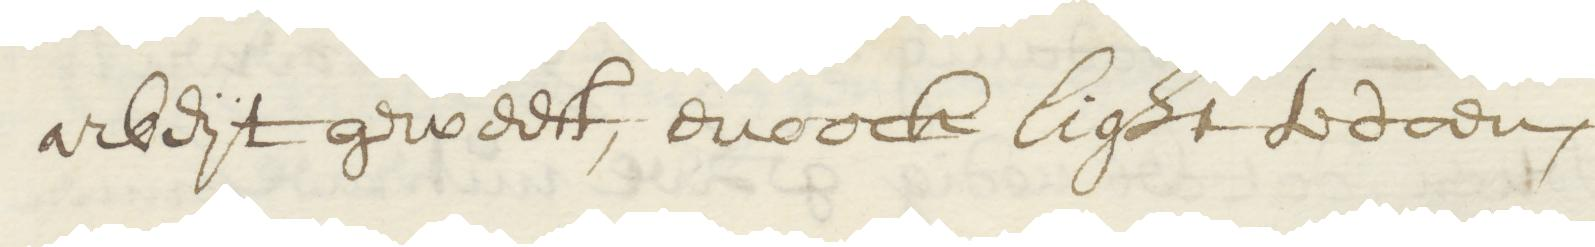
arbeijt geweest, en oock light te doen,
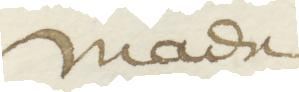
maer
